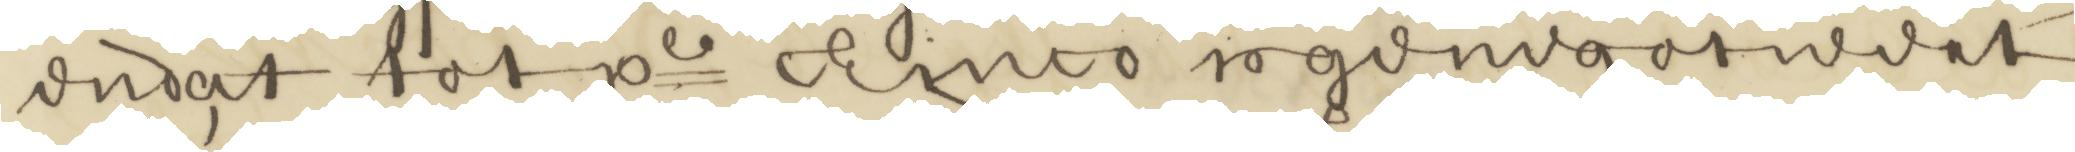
en dat tot p=lo chinco is genegotieert
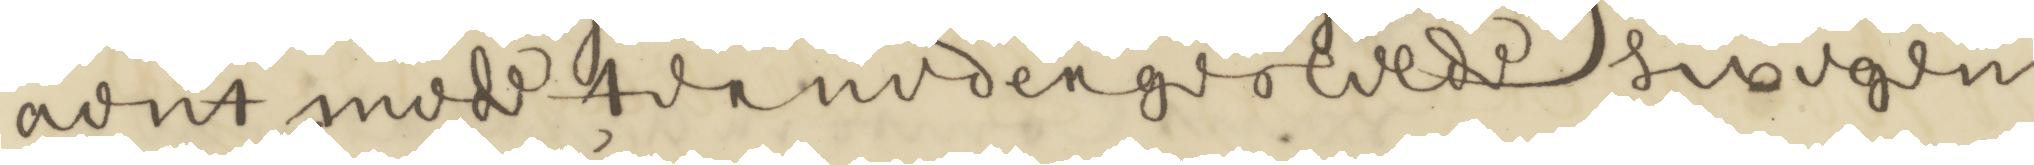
aen't mede ter nedergestelde swegen
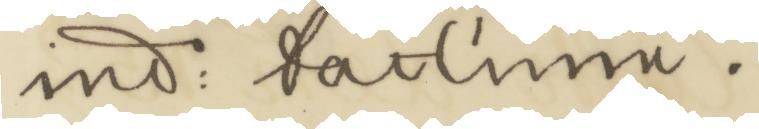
ind: factuur.
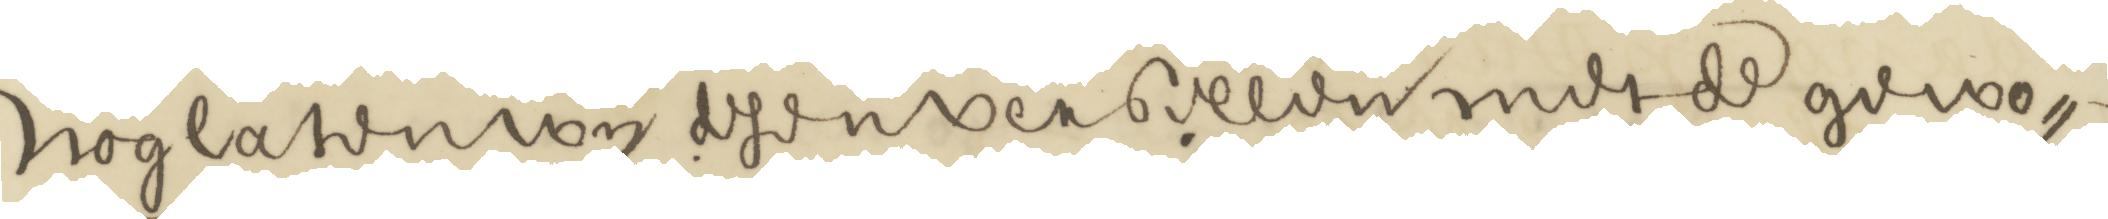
nog laten wij desen vertellen met de gewo„
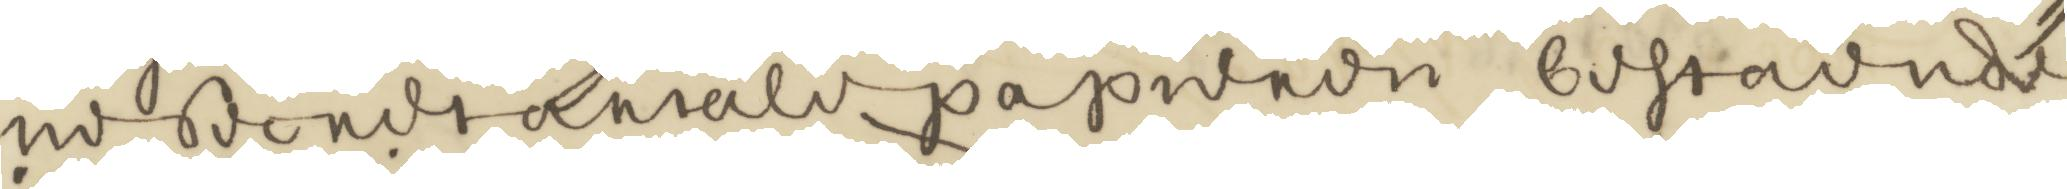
ne secretariale papieren bestaende
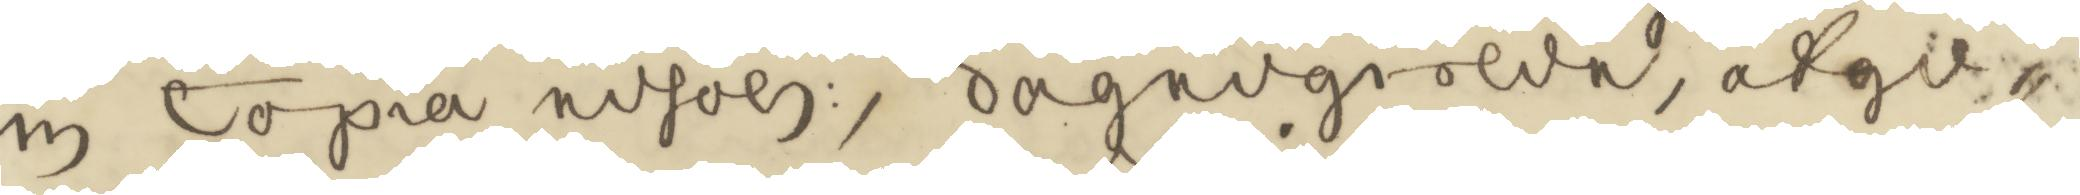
in Copia resol:, dagregister, afge„
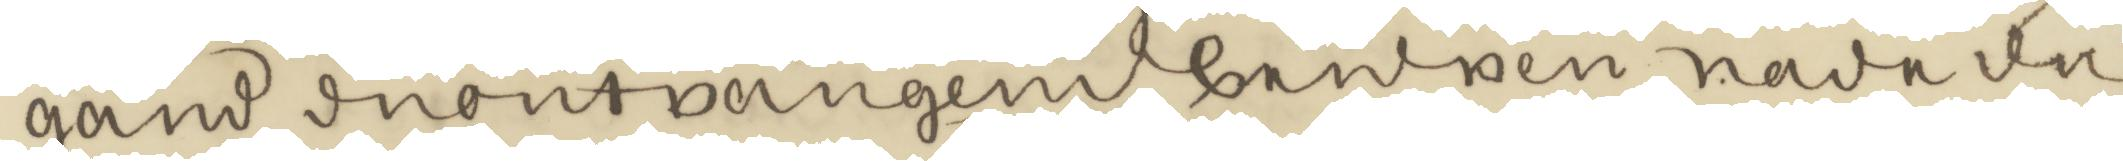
gane en ontvangene brieven naer en
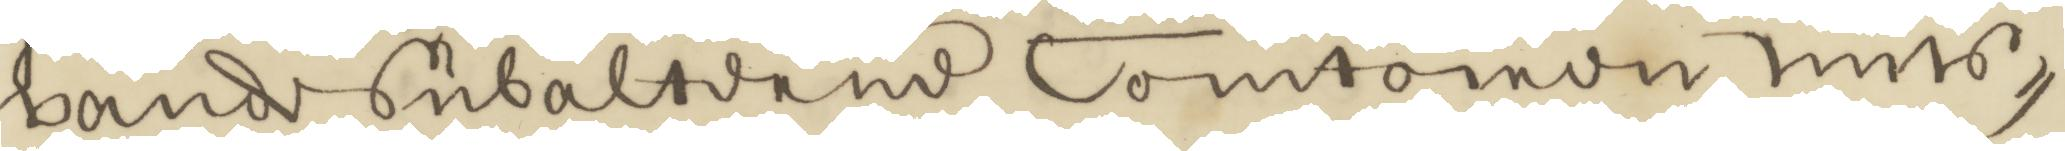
vande subalterne Comtoiren mits„
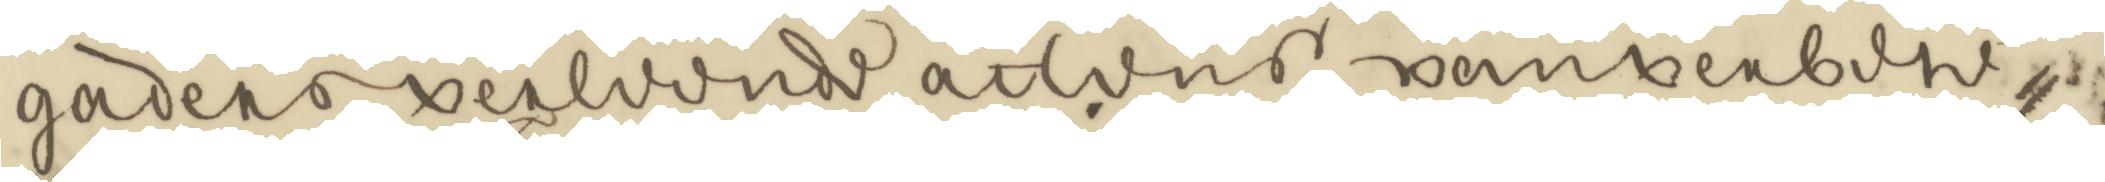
gaders verleende actens van verbete„
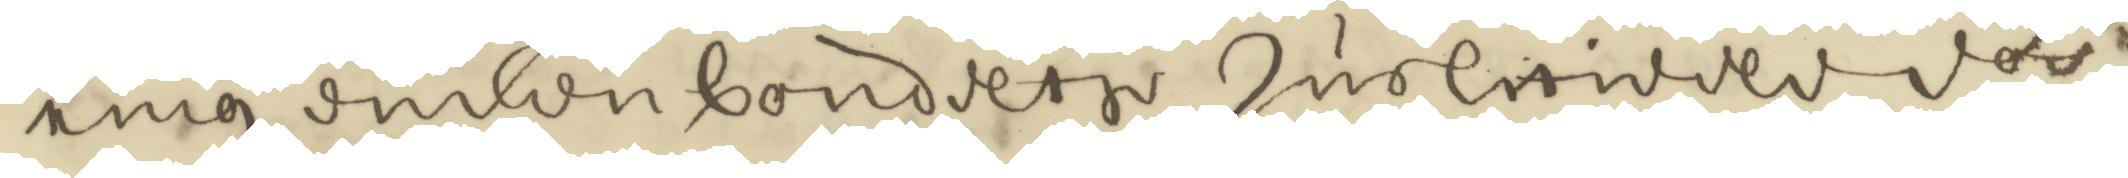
ring en Een bondeltje Justitieele d=os
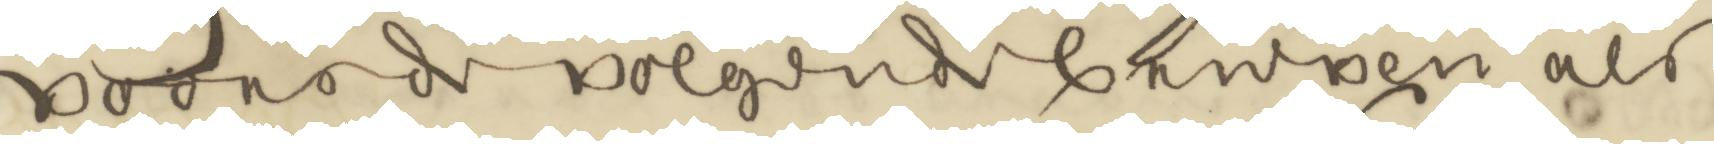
voors de volgende brieven als
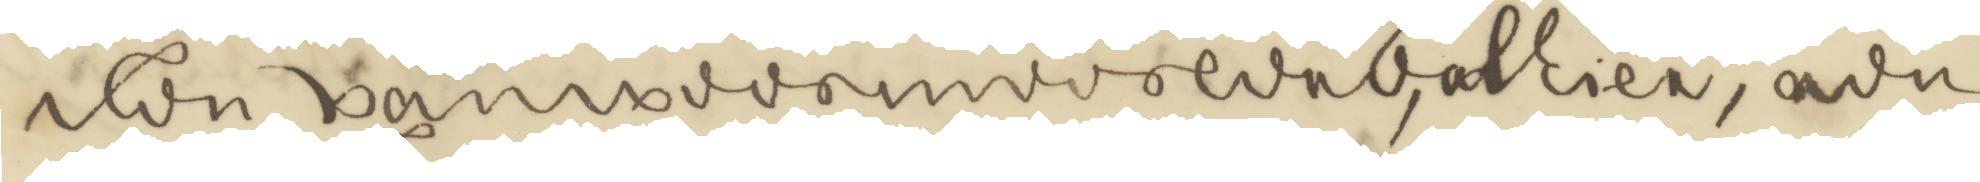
Een van weesmeesters, alhier, aen
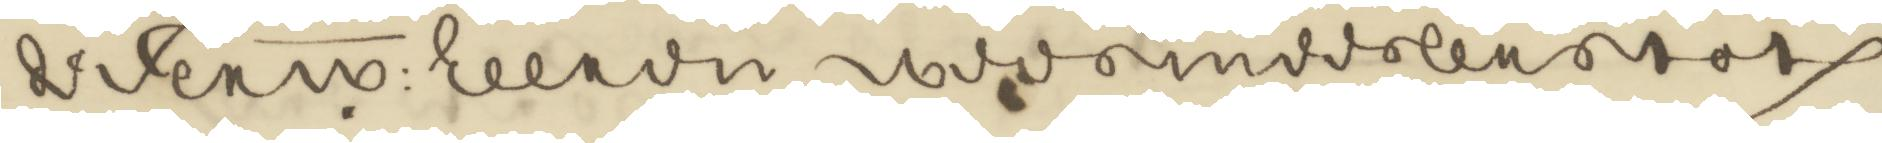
de Eerw: Heeren weesmeesters tot
